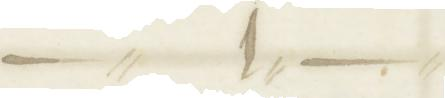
—„1„—„
